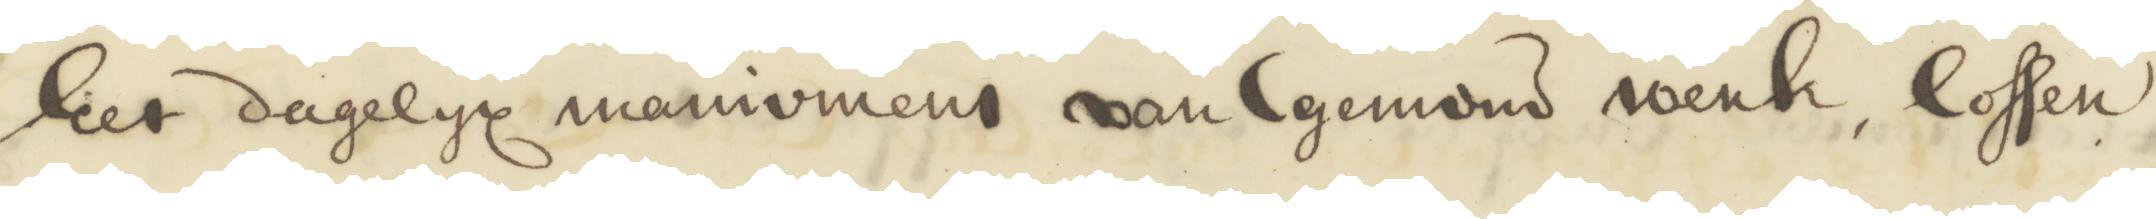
het dagelijx maniement van 't gemene werk, lossen
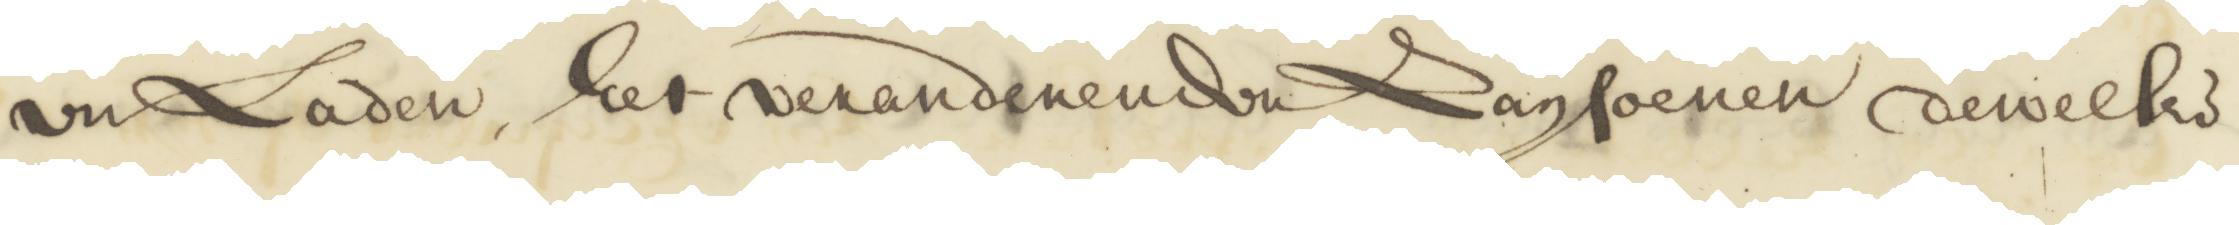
en Laden, het veranderender Zaijsoenen dewelke
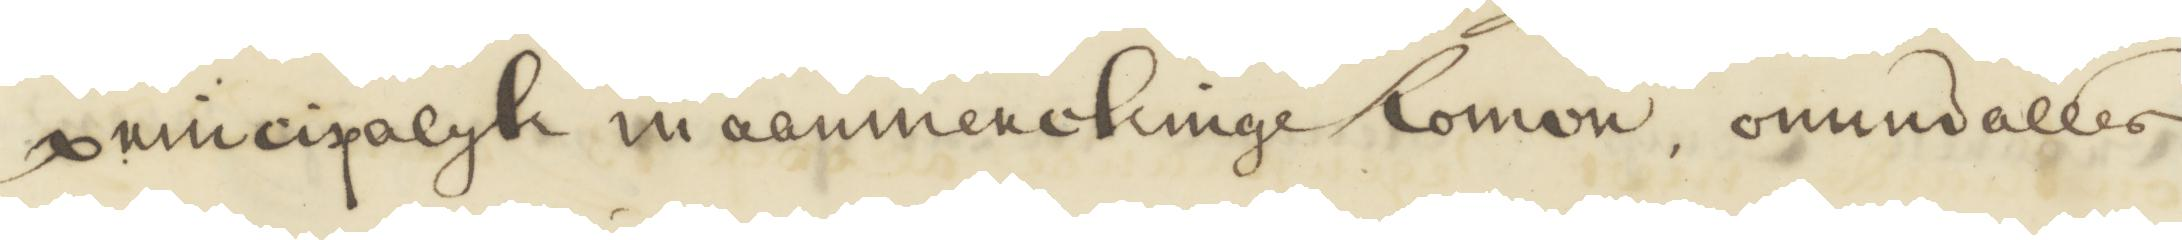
principalijk in aanmerckinge komen, omme alles
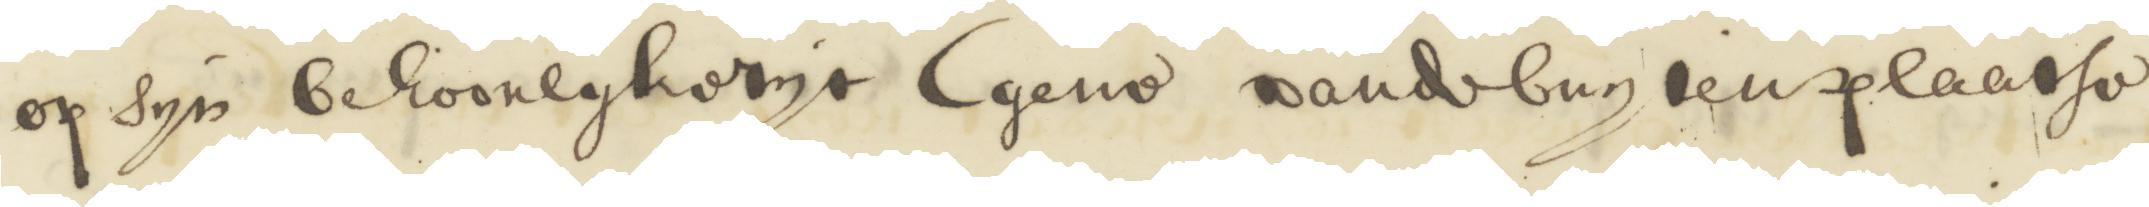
op sijn behoorlijketijt 'tgene vandebuijtenplaatse
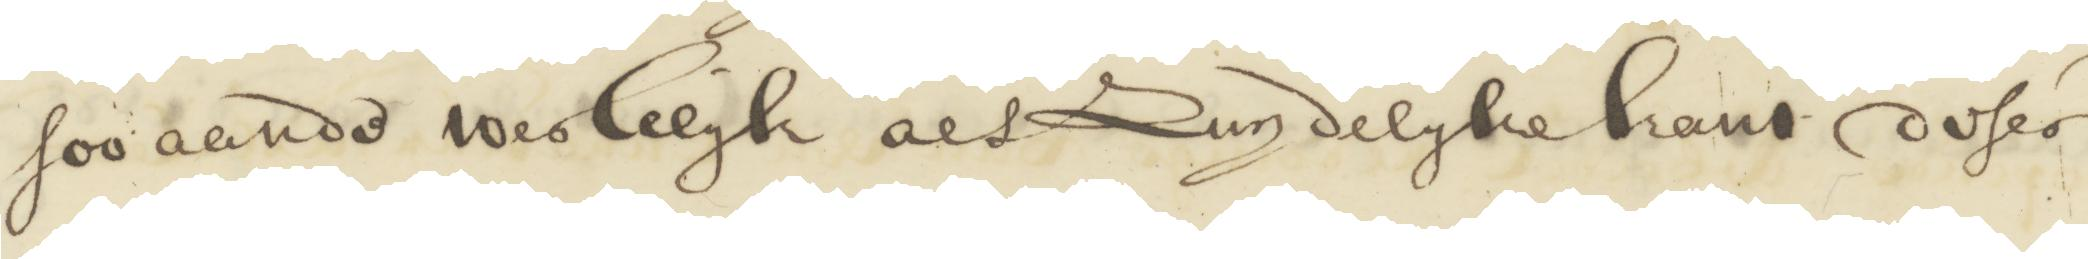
soo aande westelijk als Zuydelijke kant deses
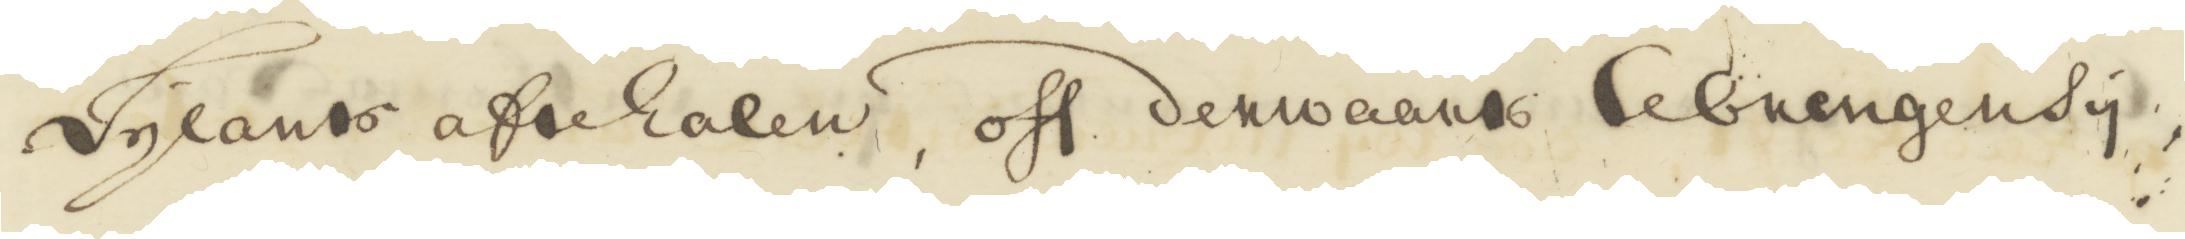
Eijlants aftehalen, off derwaarts tebrengensij,
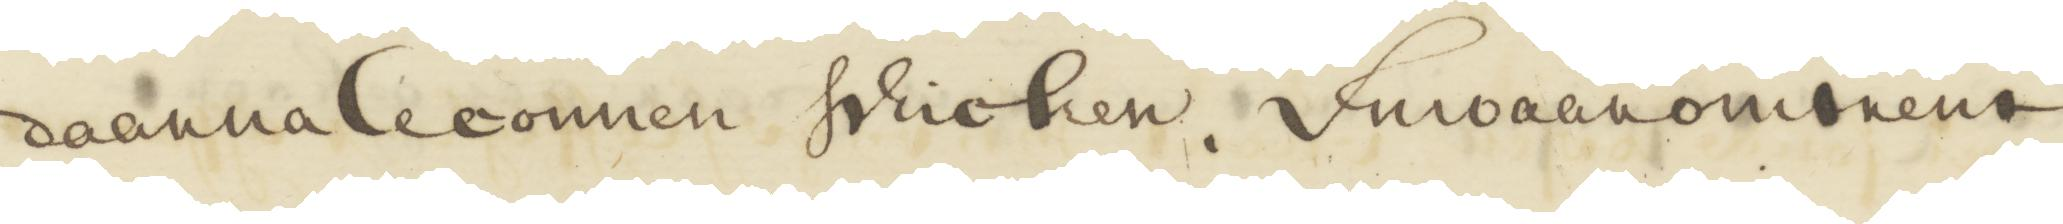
daarna teconnen schicken, Enwaaromtrent
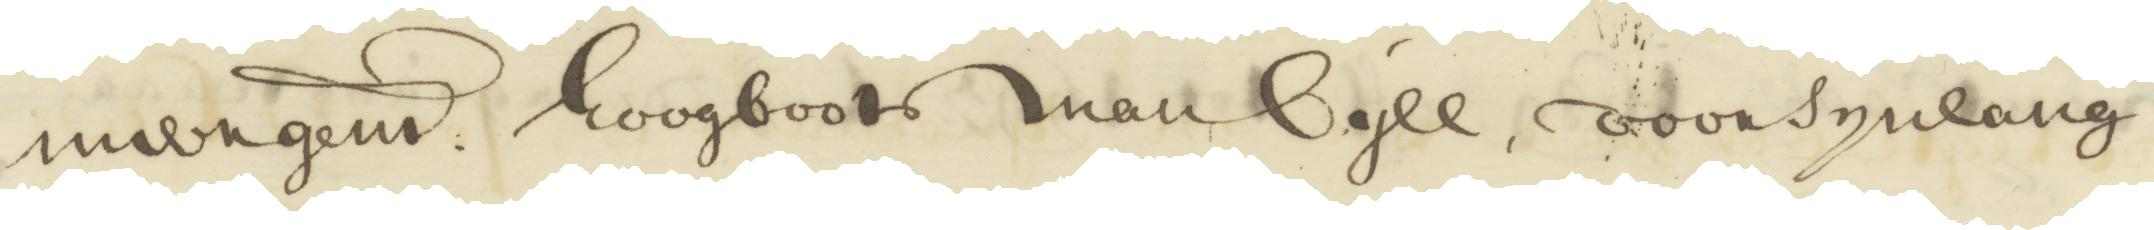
meergem: hoogbootsman Bijll, doorsijnlang
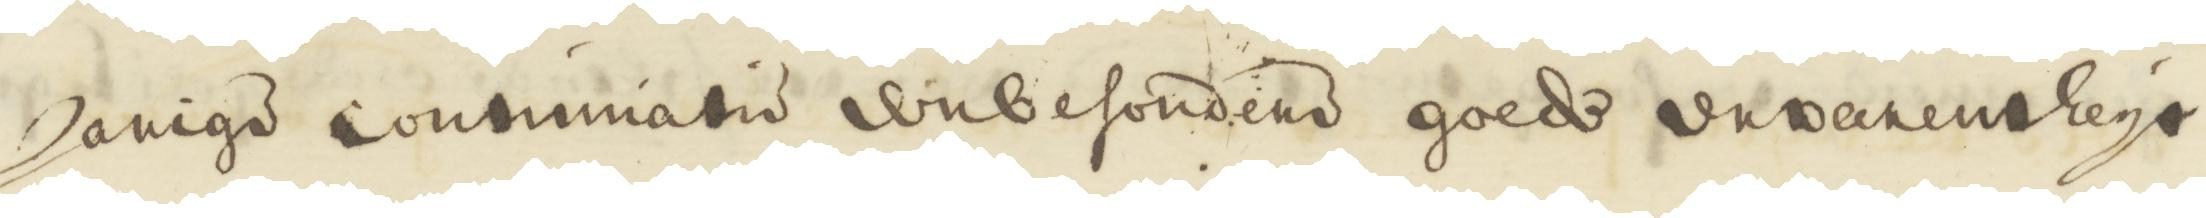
jarige continuatie eenbesondere goede ervarentheijt
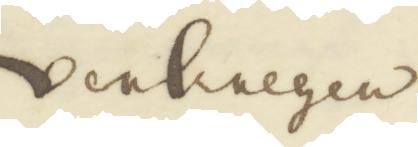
verkregen
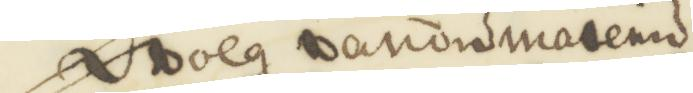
vervolg vandie materie
